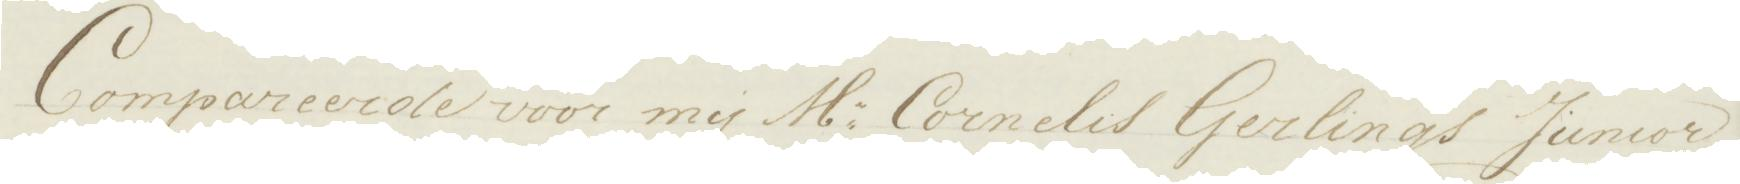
Compareerde voor mij M„r Cornelis Gerlings Junior
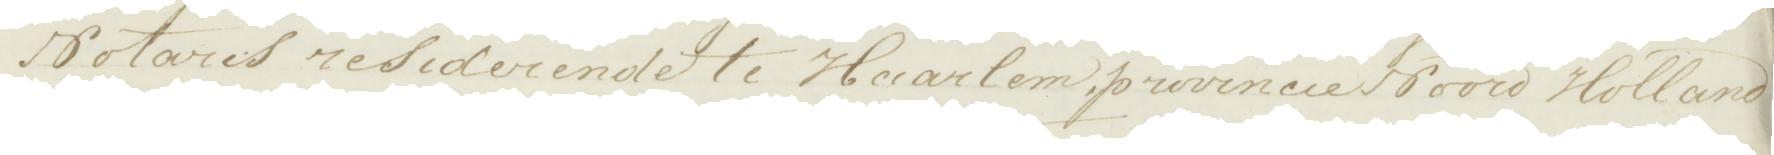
Notaris residerende te Haarlem, provincie Noord Holland
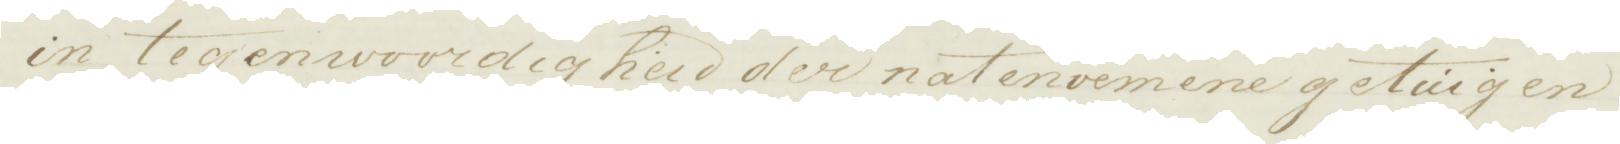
in tegenwoordigheid der natenoemene getuigen
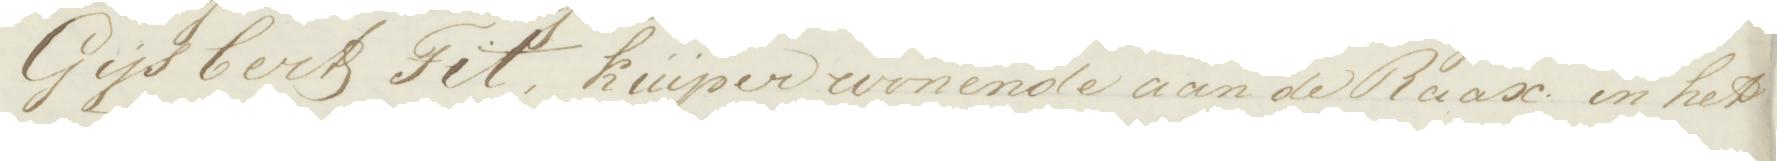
Gijsbert Fit, kuiper wonende aan de Raax in het
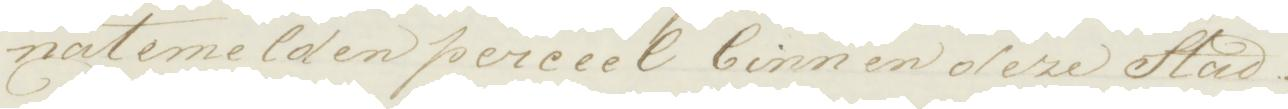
natemelden perceel binnen deze stad
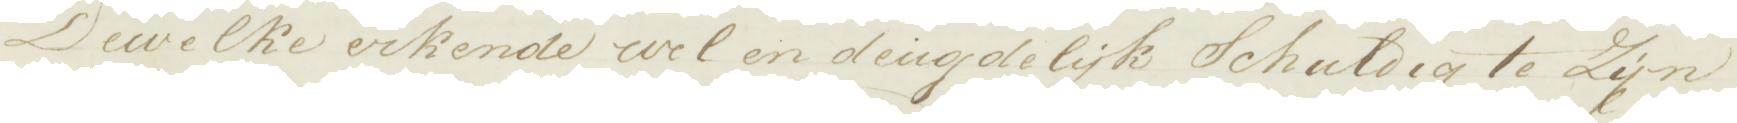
Dewelke erkende wel en deugdelijk schuldig te zijn
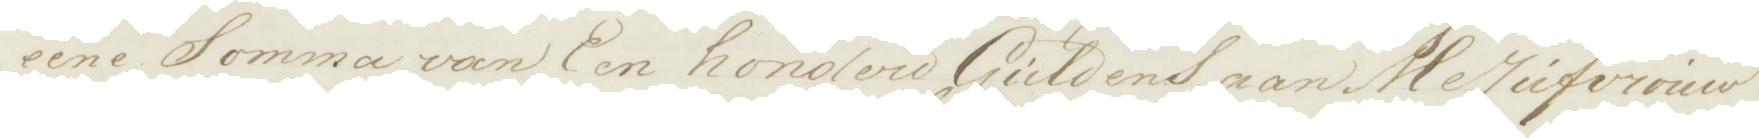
eene Somma van Een honderd Guldens aan Mejufvrouw
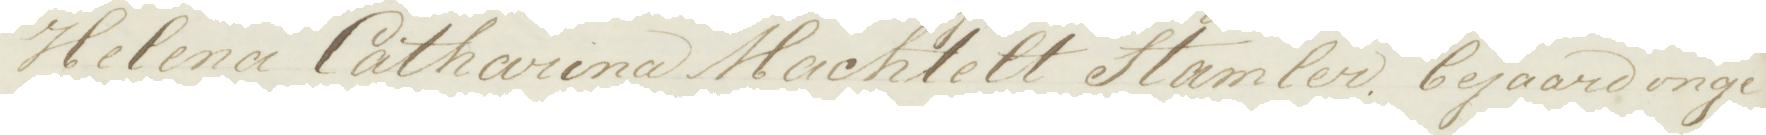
Helena Catharina Machtelt Stamler, bejaard onge
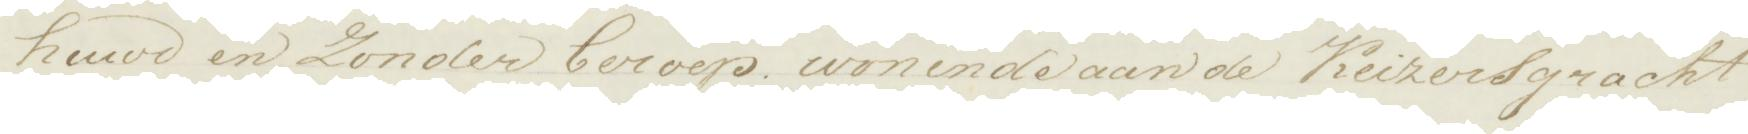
huwd en zonder beroep, wonende aan de Keizersgracht
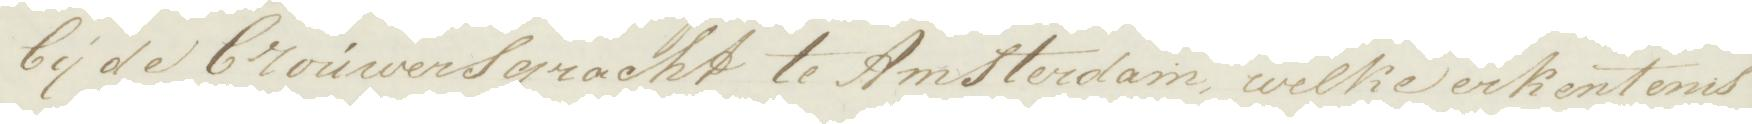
bij de brouwersgracht te Amsterdam, welke erkentenis
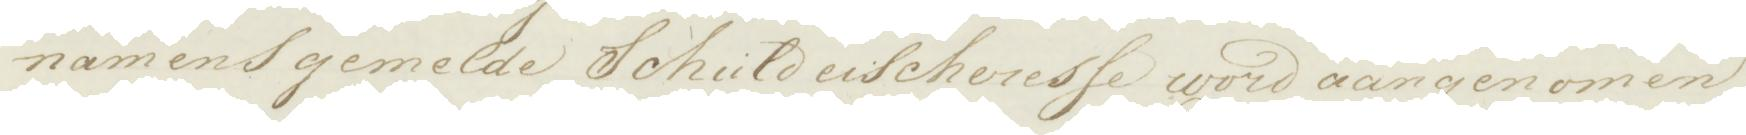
namens gemelde Schuld eischeresse word aangenomen
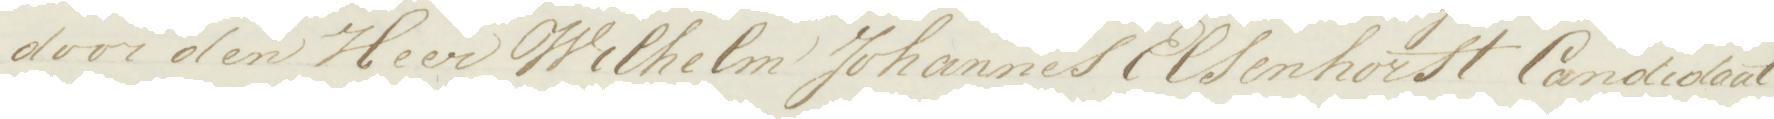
door den Heer Wilhelm Johannes Elsenhorst Candidaat
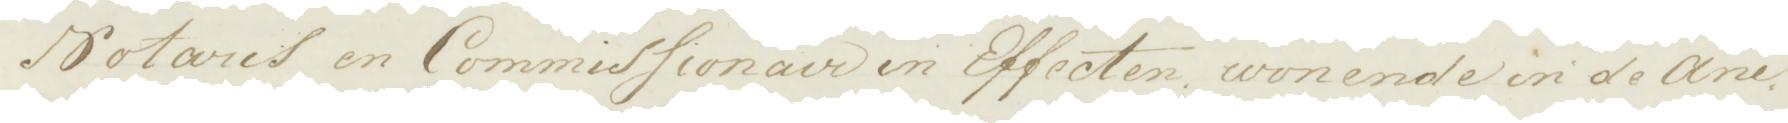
Notaris en Commissionair in Effecten, wonende in de Ane„
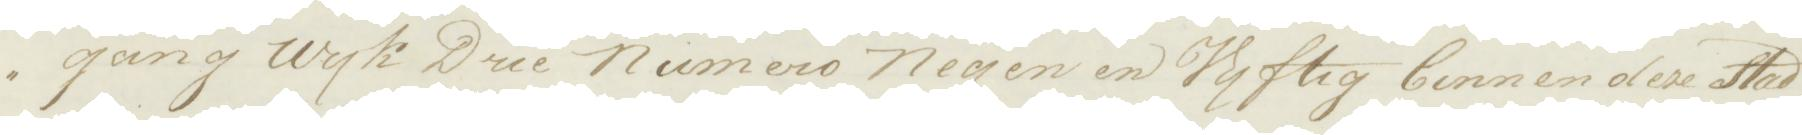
„gang Wyk Drie Numero Negen en Vyftig binnen deze stad
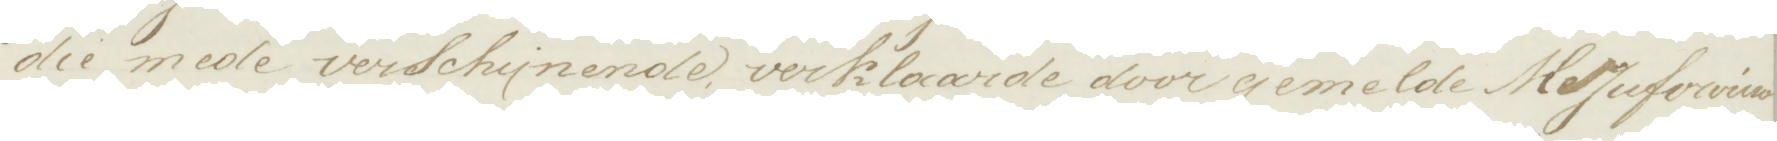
die mede verschijnende, verklaarde door gemelde Mejufvrouw
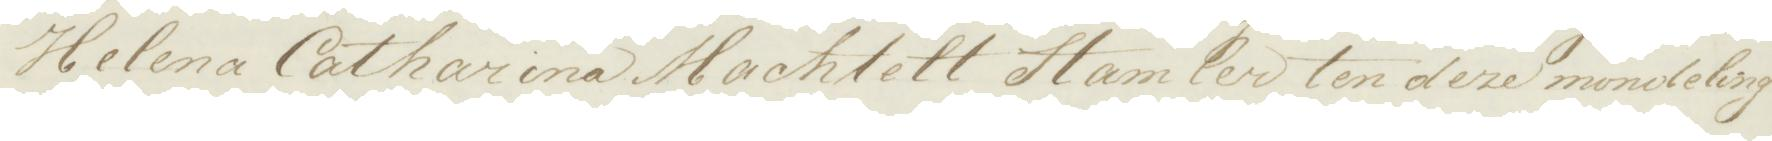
Helena Catharina Machtelt Stamler ten deze mondeling
